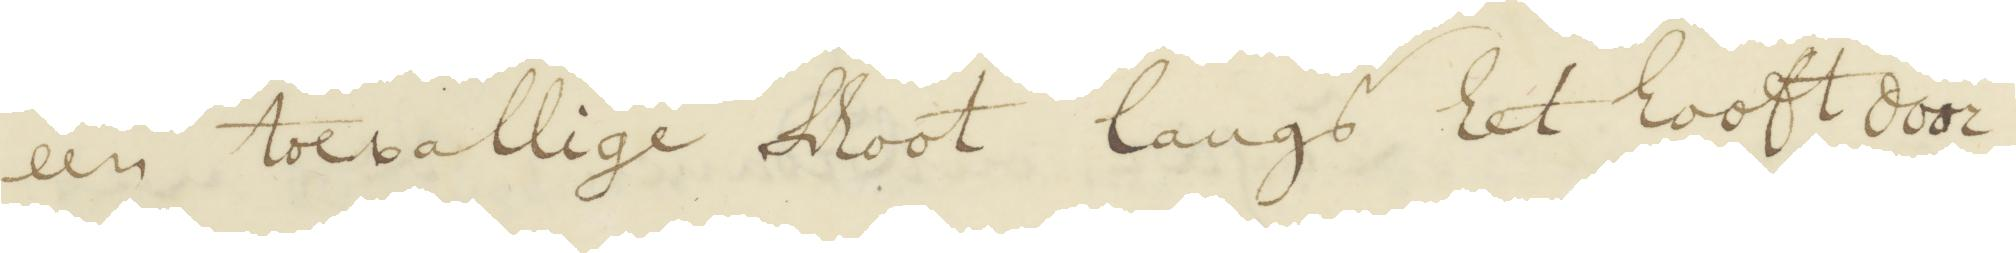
een toevallige schoot langs het hooft door
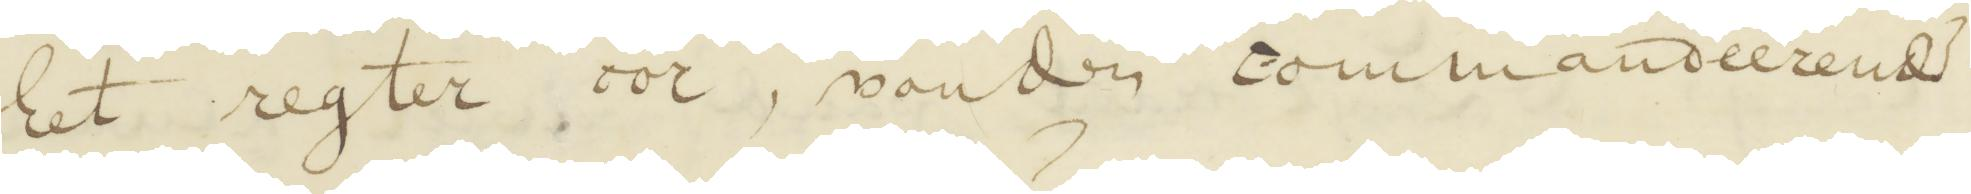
het regter oor, van den commandeerende
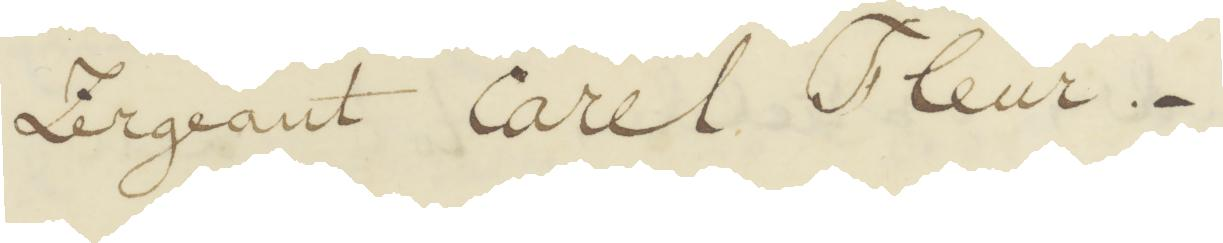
zergeant Carel Fleur. -
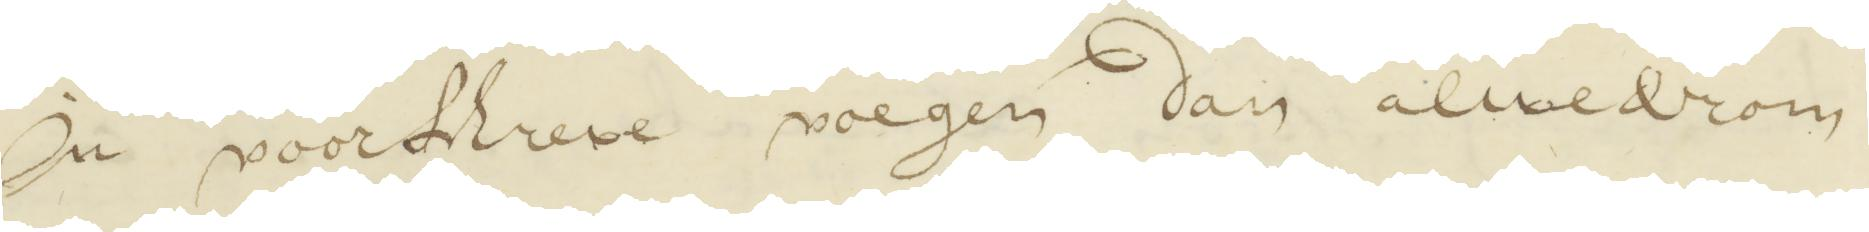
Jn voorschreve voegen dan alwederom
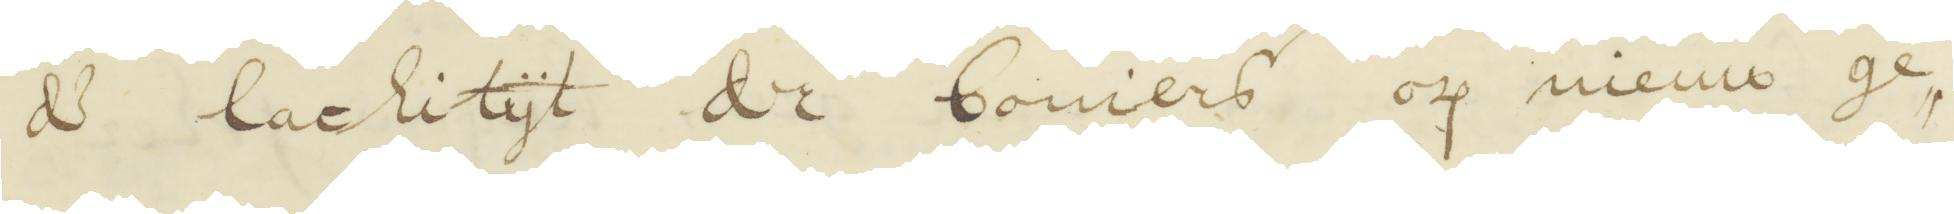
de lachitijt der boniers op nieuw ge„
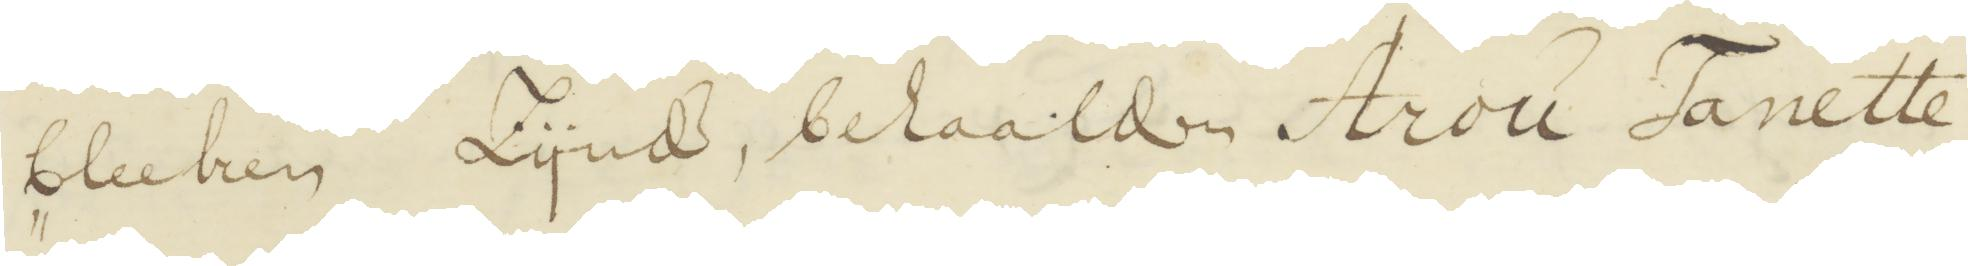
bleeken zijnde, behaalden Arou Tanette
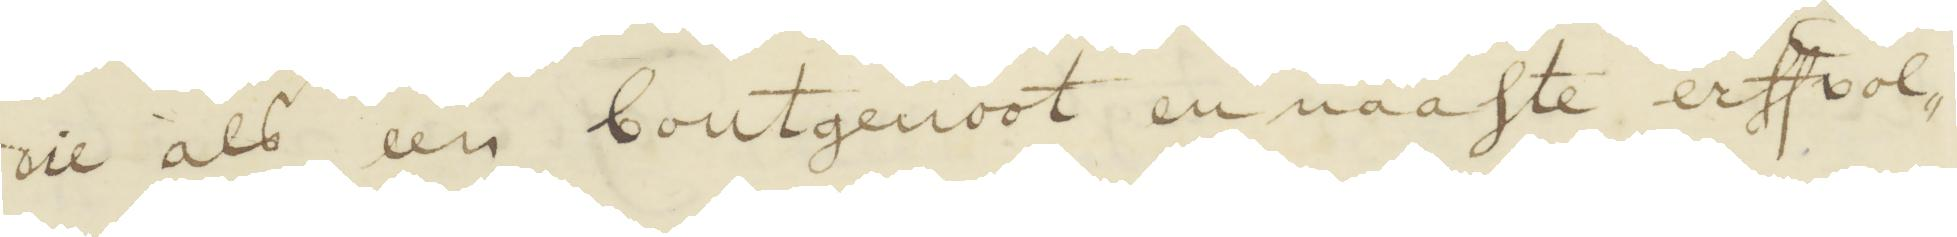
die als een bontgenoot en naaste erffvol„
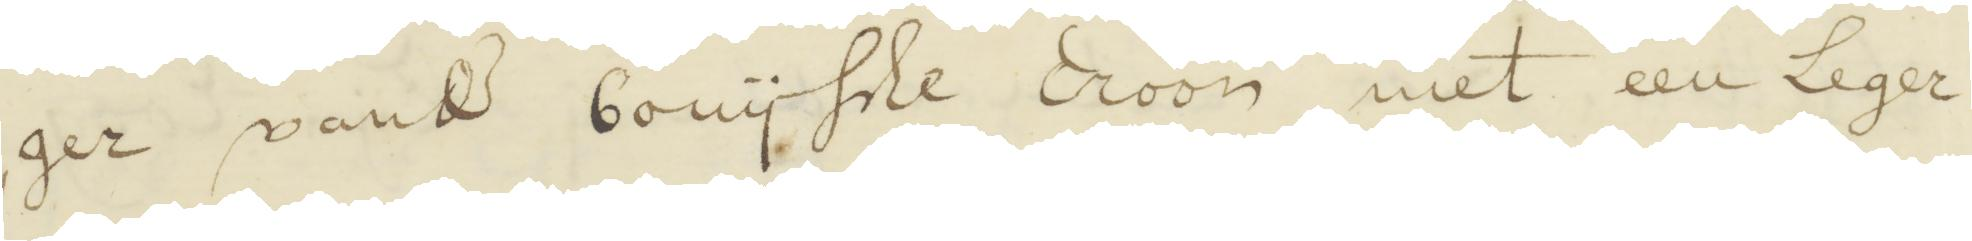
„ger vande bonijsche Croon met een Leger
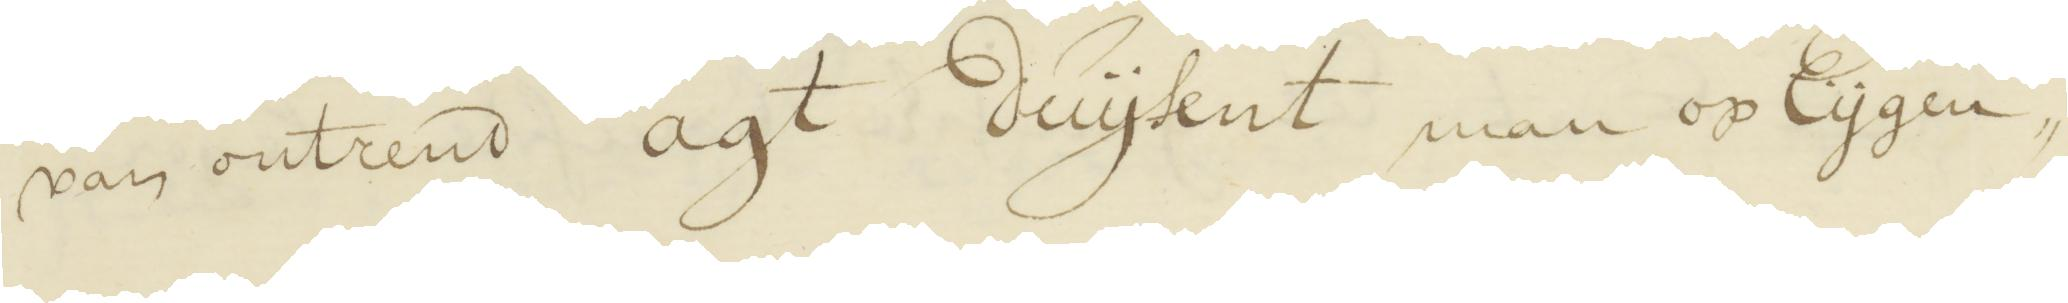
van ontrend agt duijsent man op Eijgen„
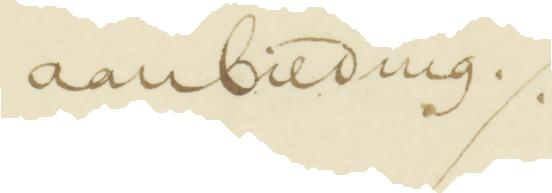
aanbieding./.
